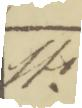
st.s
